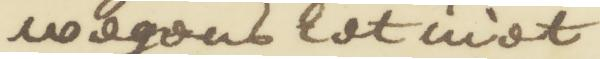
wegens het niet
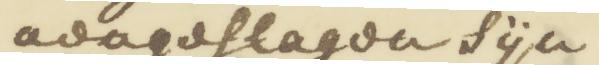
aengeslagen sijn
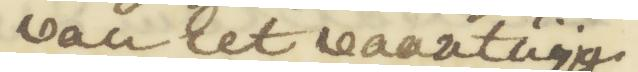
van het vaartuijg
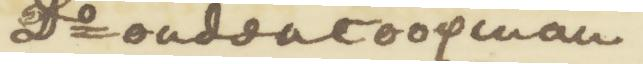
D=o ondercoopman
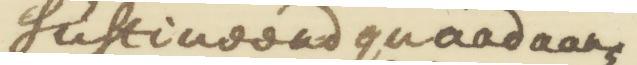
sustineerd quaadaar„
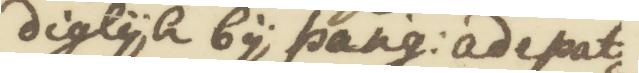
diglijk bij pang: adepat„
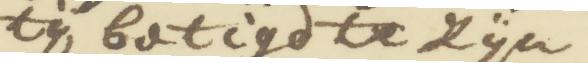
tij betigd te zijn
